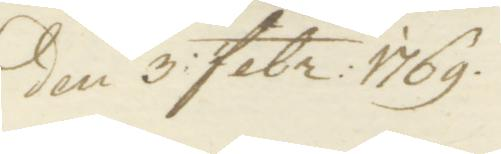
den 3: febr: 1769.
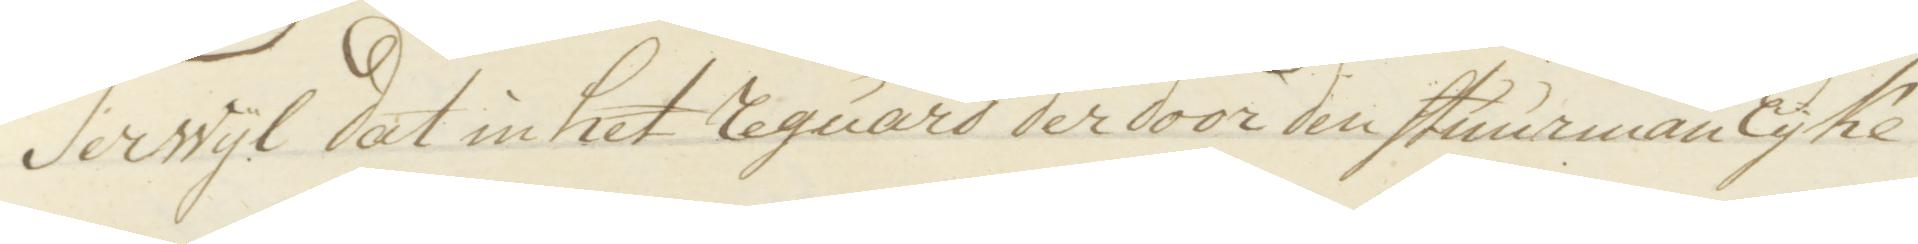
Terwijl dat in het reguard der door den stuurman Eijke
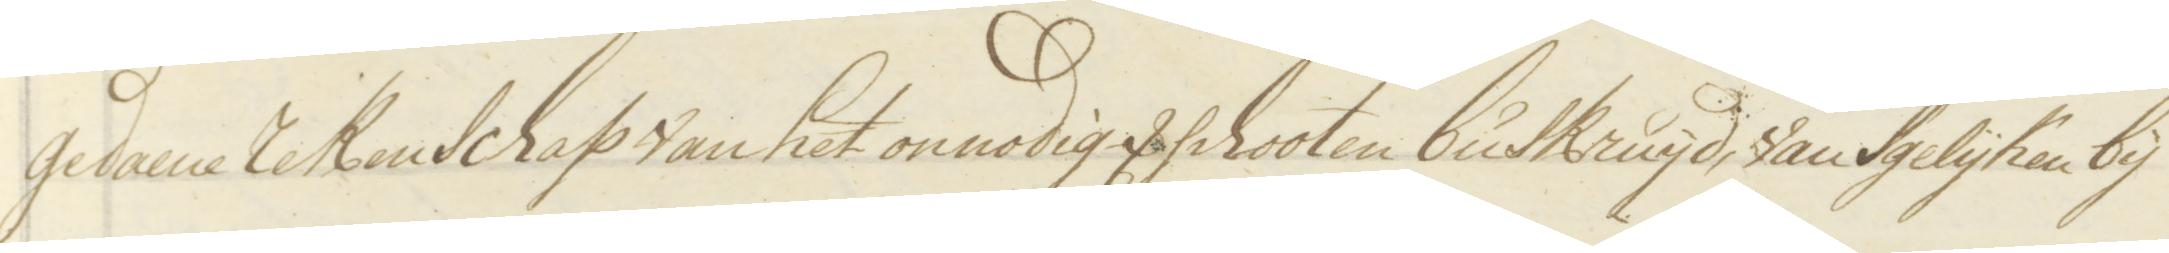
gedaene rekenschap van het onnodig verschooten buskruijd, van s'gelijken bij
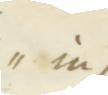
„ in
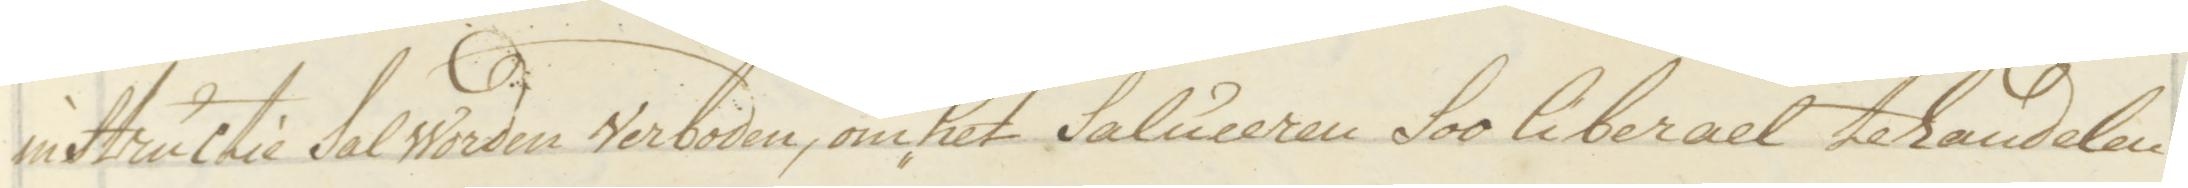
instructie sal worden verboden, om„ het salueeren soo liberael te handelen
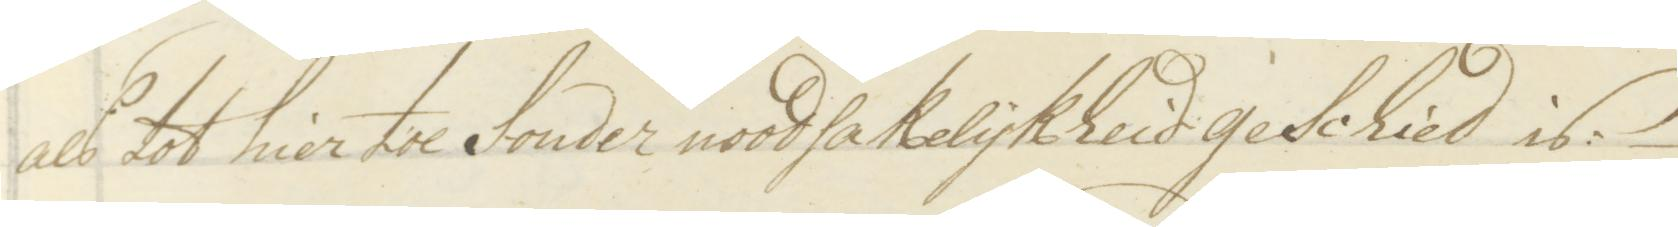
als tot hier toe sonder noodsakelijkheid geschied is:
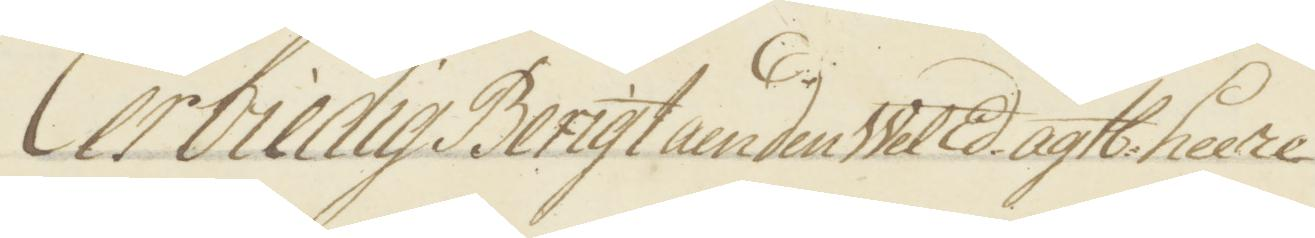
Eerbiedig Berigt aen den Wel Ed. agtb: heere
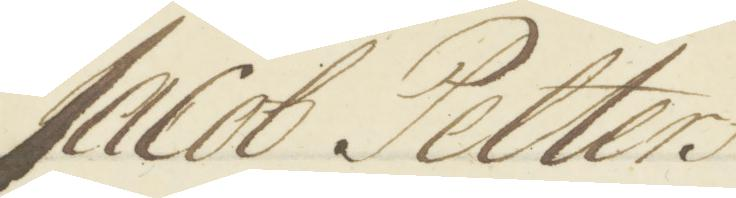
Iacob Pelters
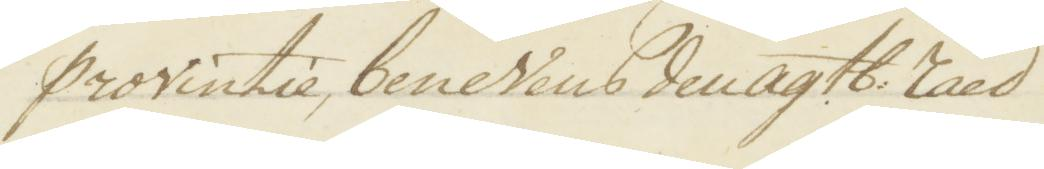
provintie, benevens den agtb: raed
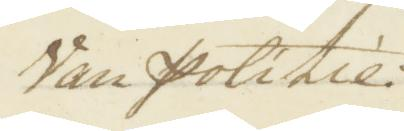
van politie:
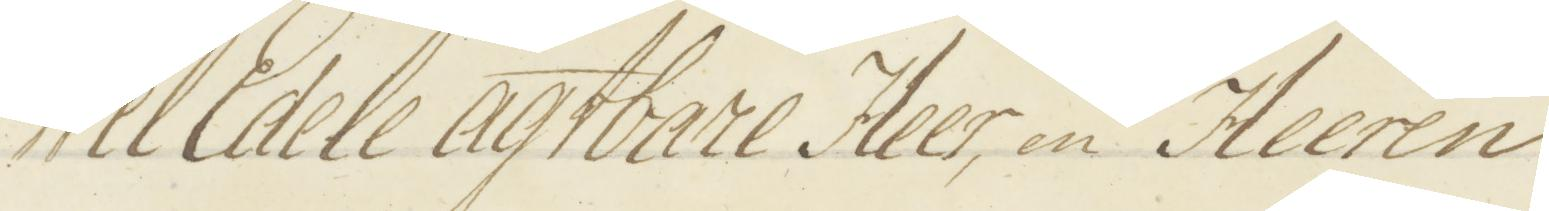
Wel Edele agtbare Heer, en Heeren
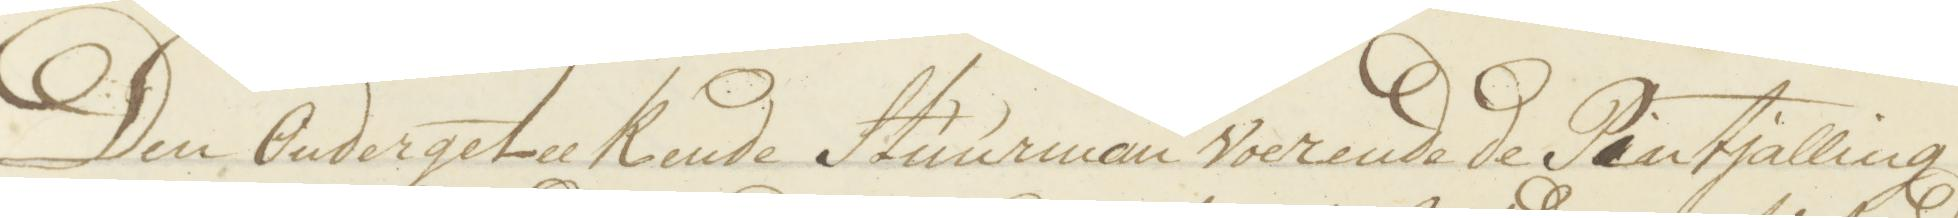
Den ondergeteekende stuurman voerende de Pintjalling
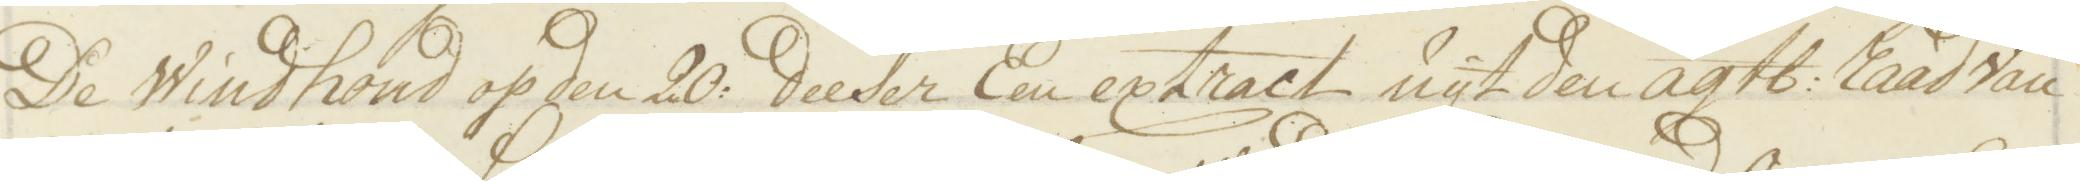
De windhond op den 20: deeser Een extract uijt den agtb: raad van
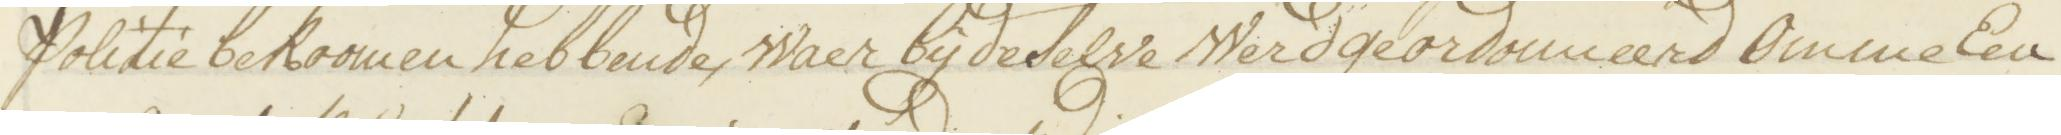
Politie bekoomen hebbende, waer bij deselve werd geordonneerd omme Een
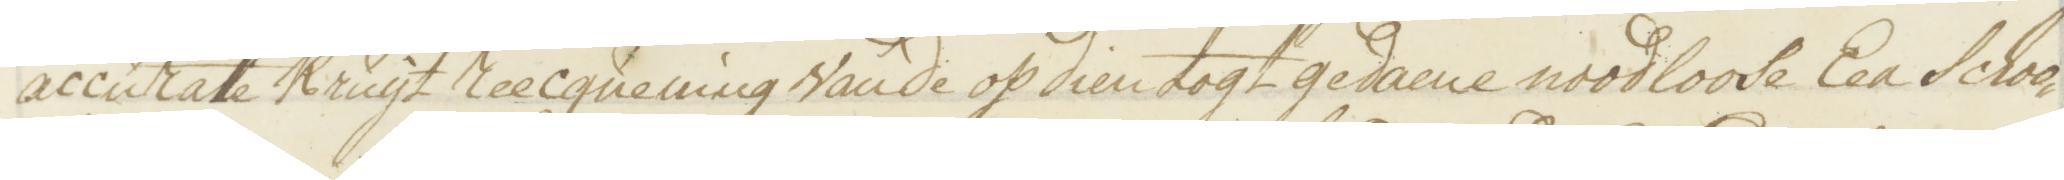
accurate kruijt reecquening van de op dien togt gedaene noodloose Eer schoo„
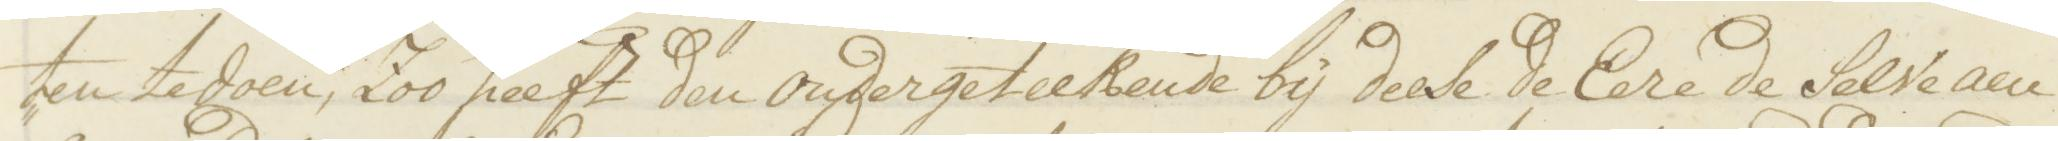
„ten tedoen, zoo heeft den ondergeteekende bij deese de Eere de selve aen
